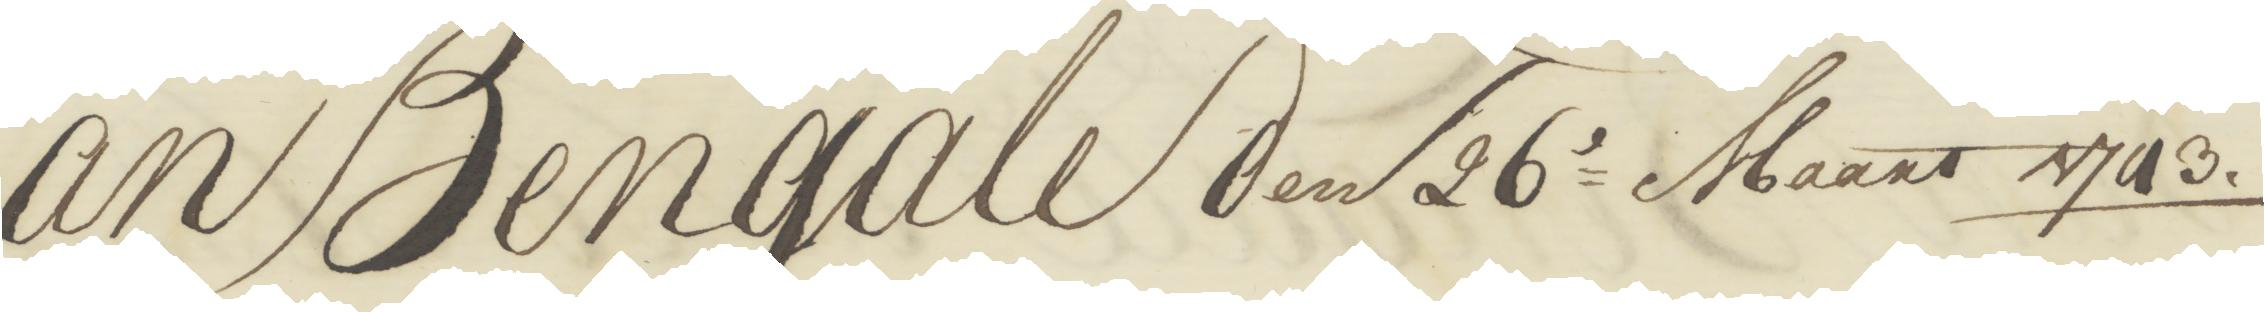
Van Bengale den 26=' Maart 1743.
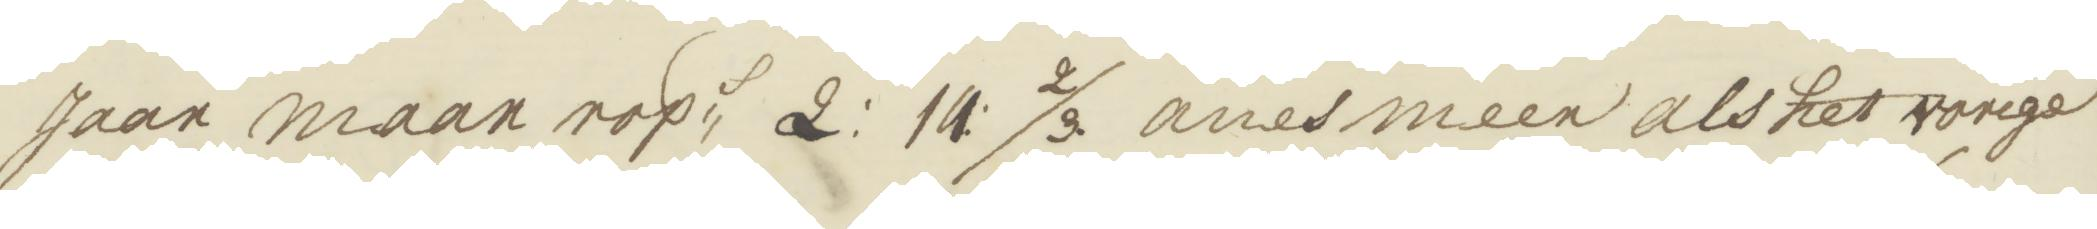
Jaar maar rop„s 2: 14: 2/3 anes meer als het vorige
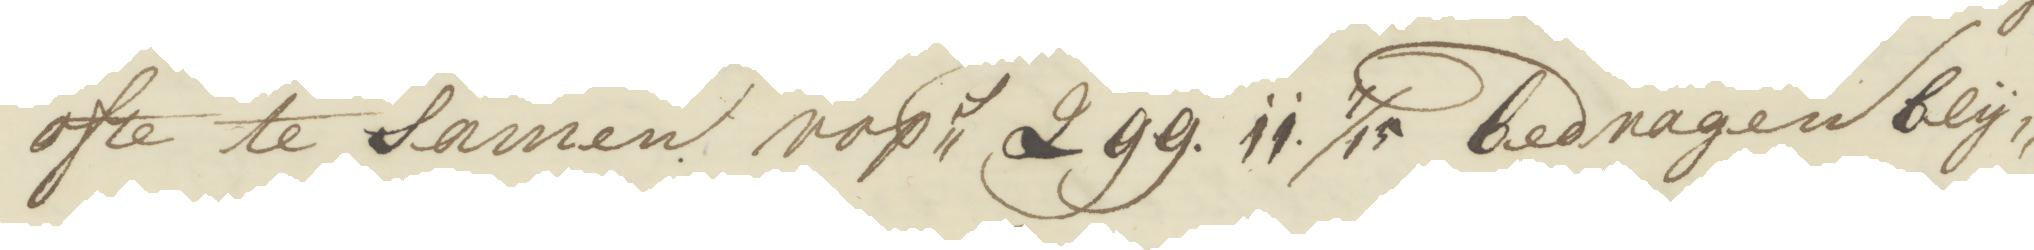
ofte te samen rop„s 299. 11. 7/15 bedragen blij„
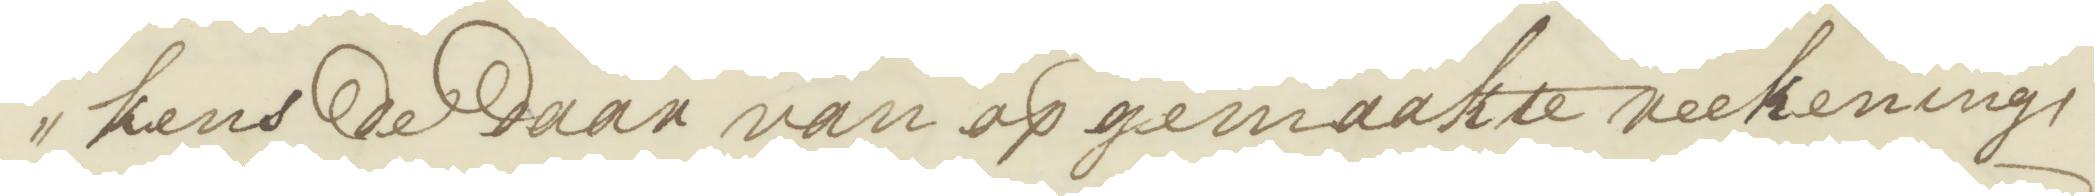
„kens de daar van op gemaakte reekening,
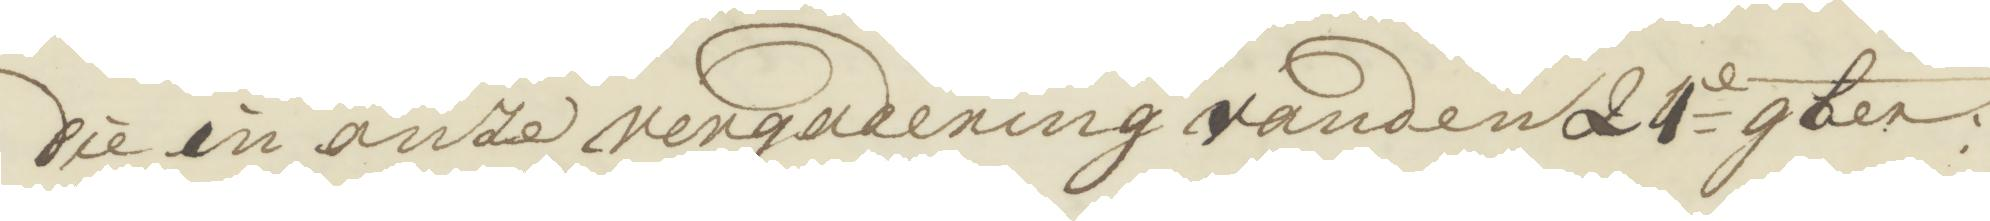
die in onze vergadering van den 24=e 9ber:
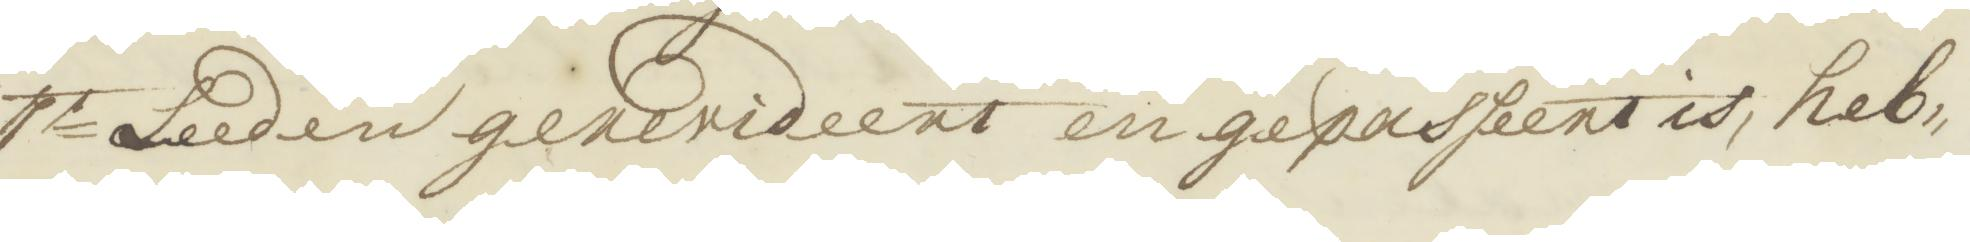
J=t Leeden gerevideert en gepasseert is, heb„
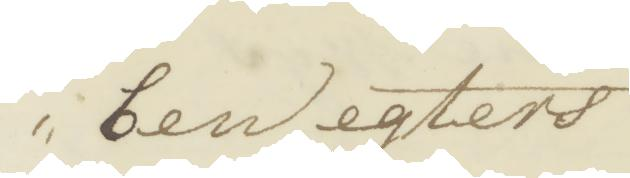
„ben egters
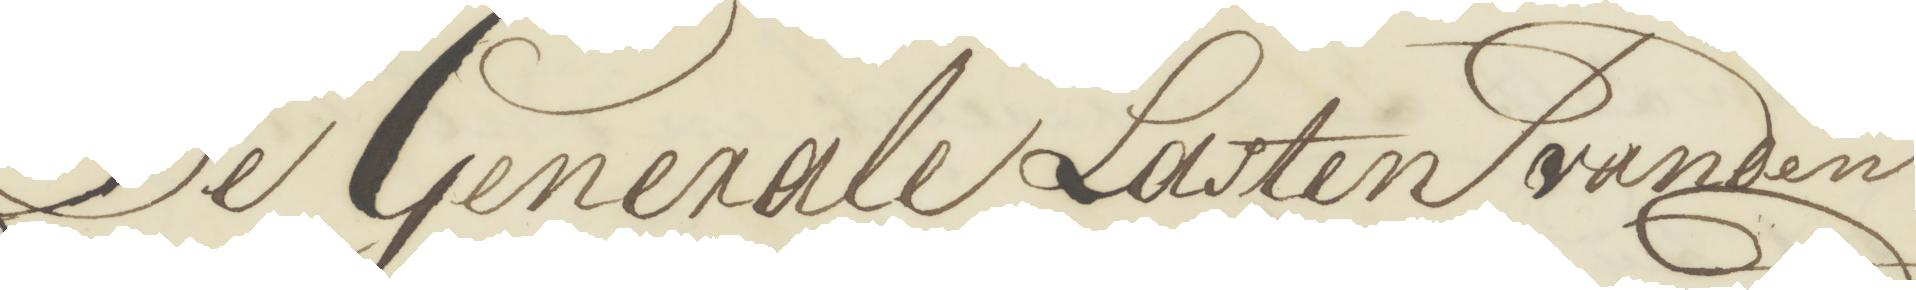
De Generale Lasten van den
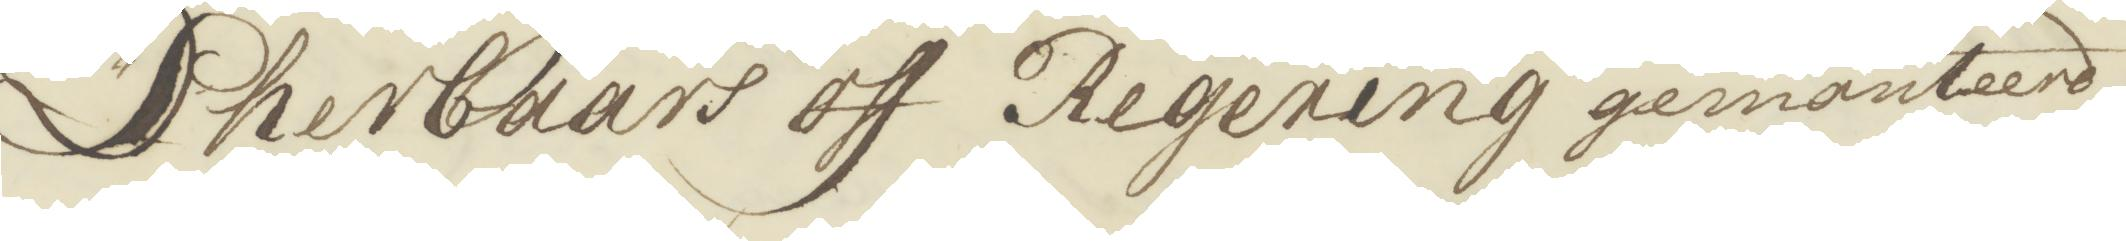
Dherbaars off Regering gemanteerd
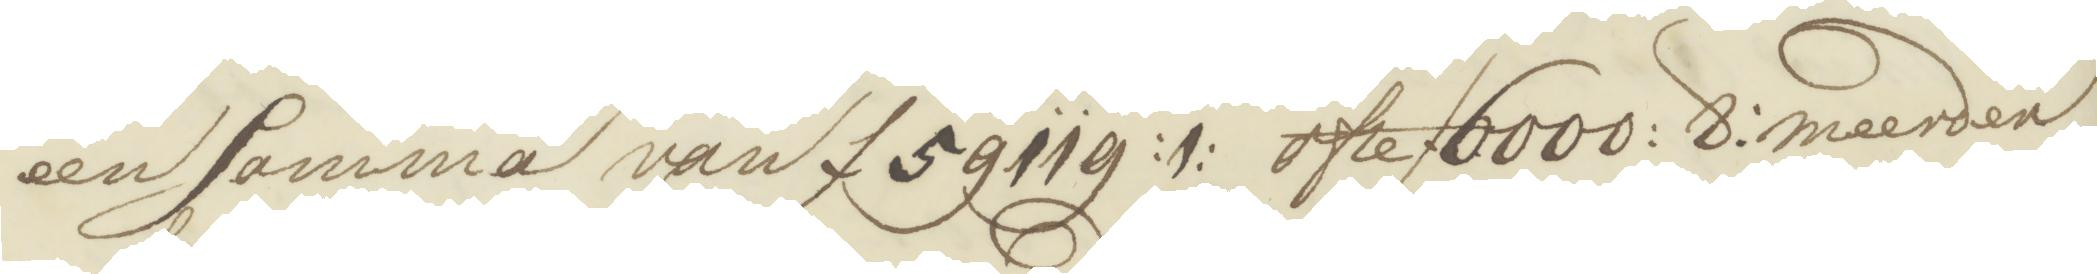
een Somma van ƒ 59119: 1 :1: ofte ƒ6000: 8: meerder
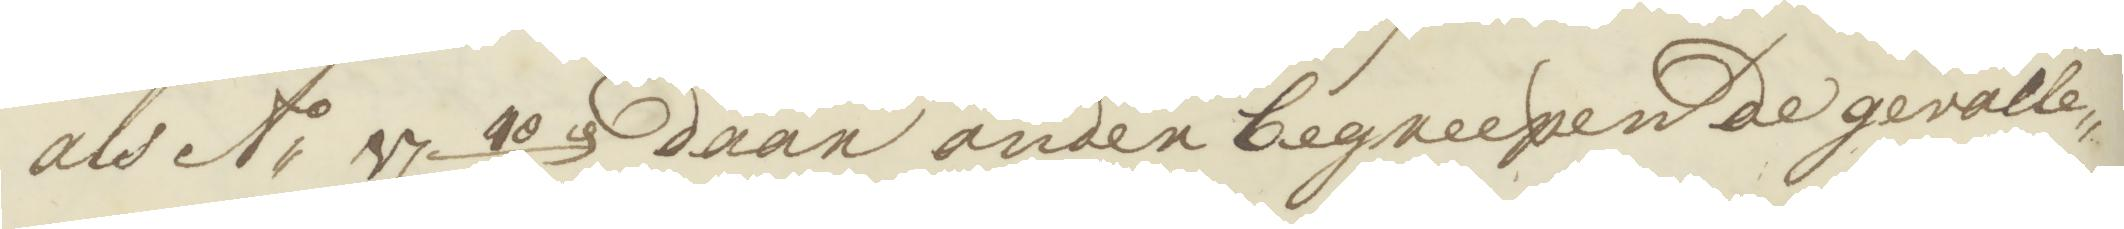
als A„o 1740/41. en daaronder begreepen de gevalle„
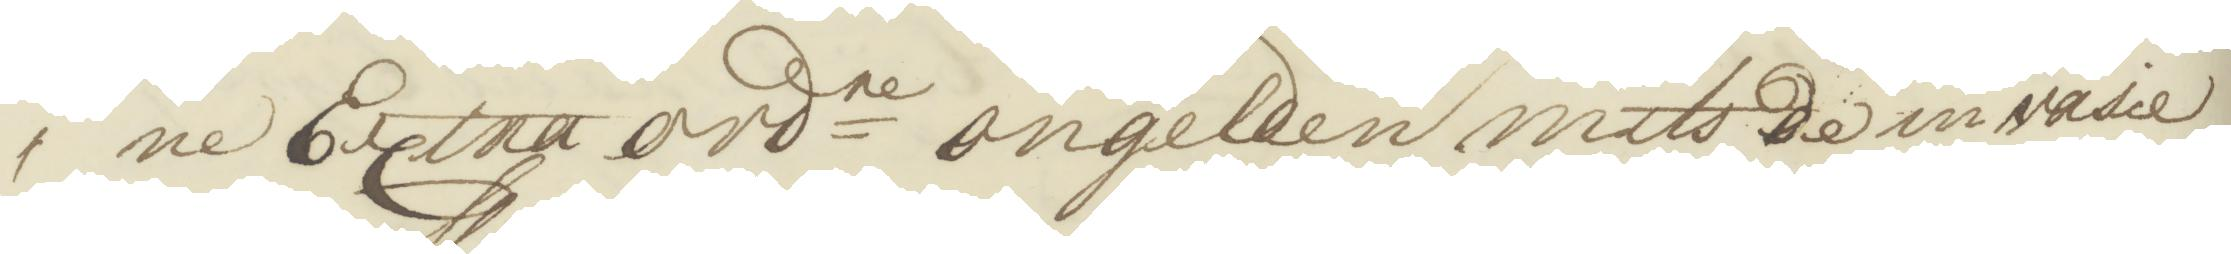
„ne Extra ord=re ongelden mits de invasie
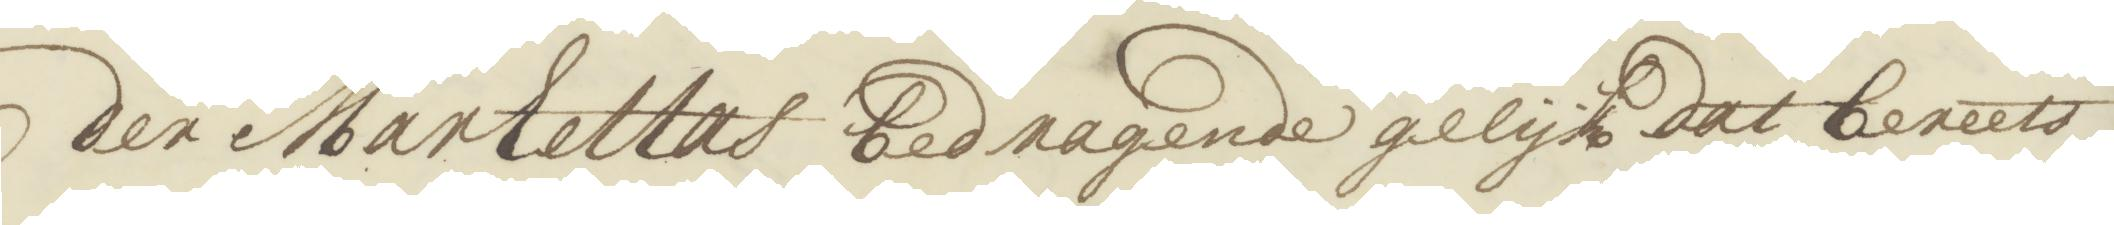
der Marhettas bedragende gelijk dat bereets
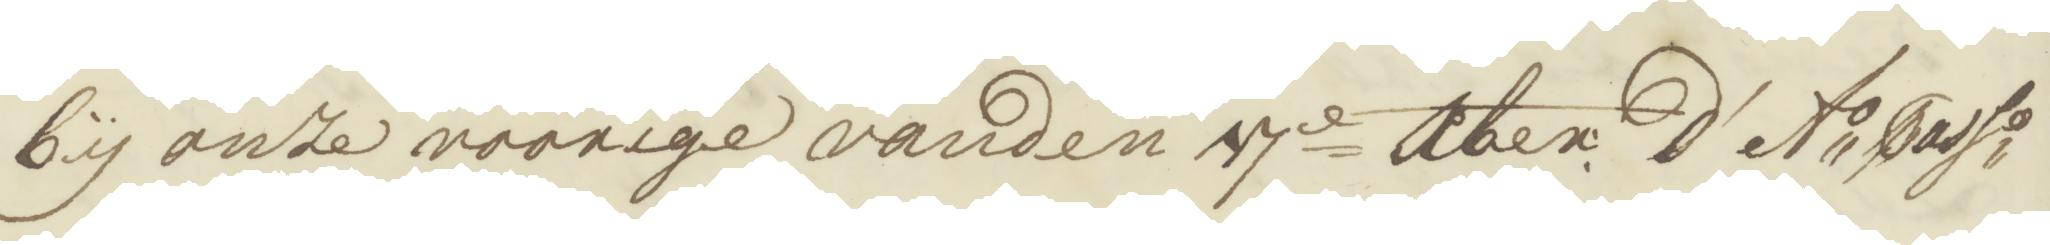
bij onze voorige van den 17=e xber: d’ A„o pass„o
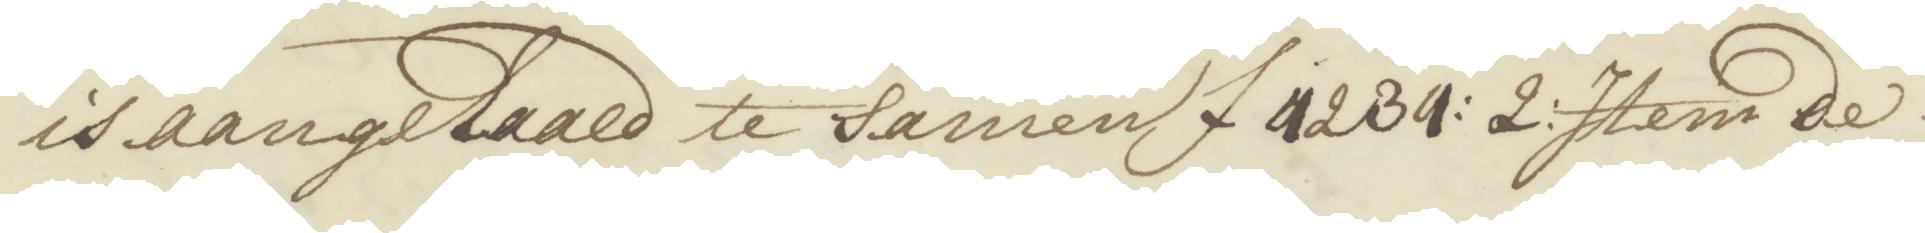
is aangehaald te samen ƒ 4234: 2: Item de
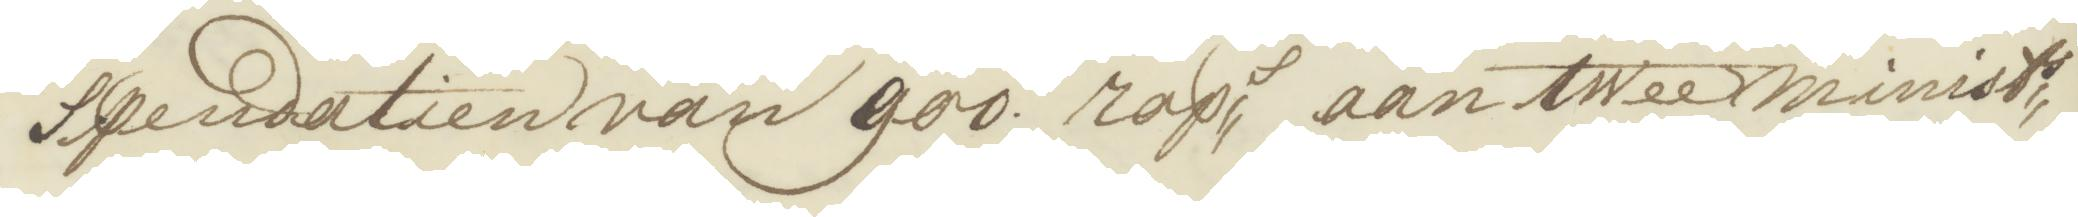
spendatien van 900. rop„s aan twee minist„s
